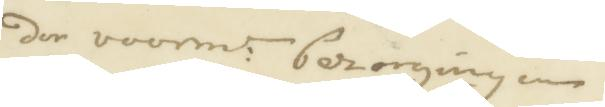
der voorm: bezorgingen
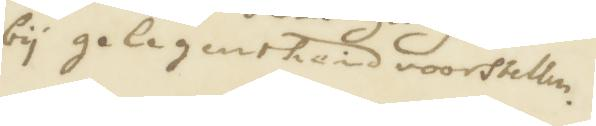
bij gelegentheid voorstellen.
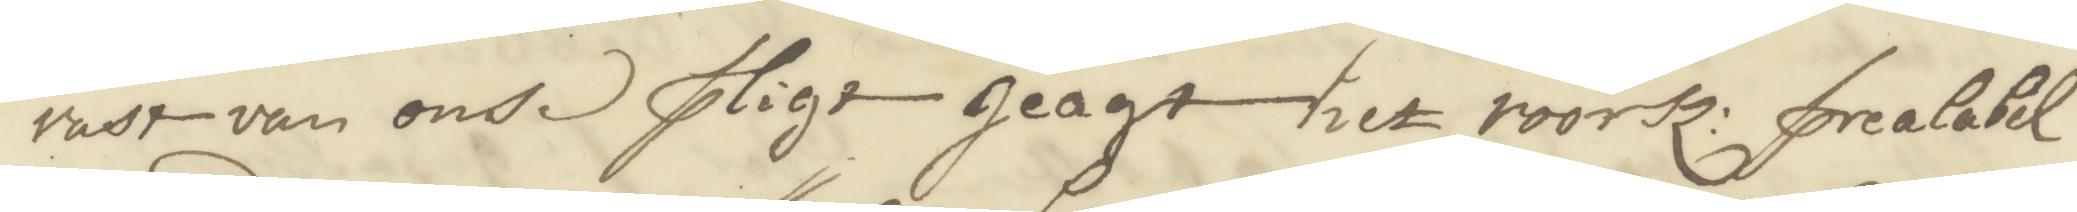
vast van onse pligt geagt het voorsz: prealabel
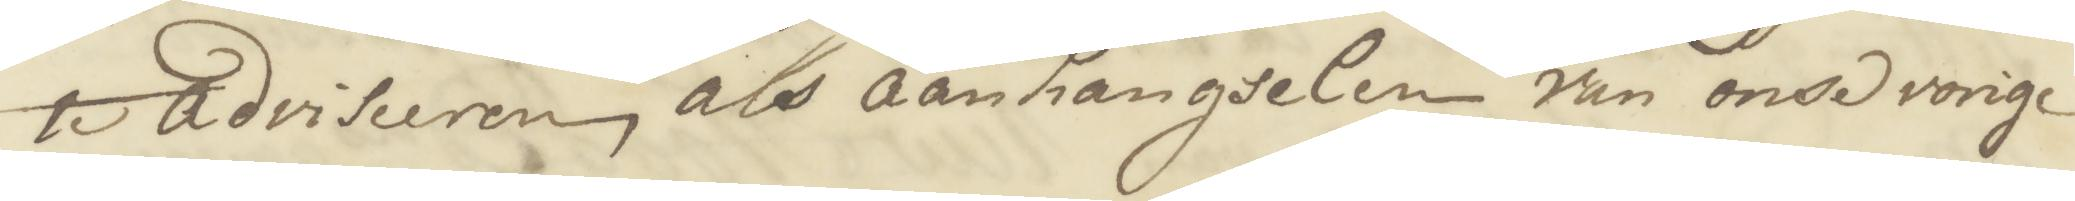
te adviseeren als aanhangselen van onse vorige
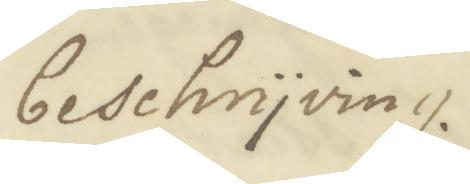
beschrijving.
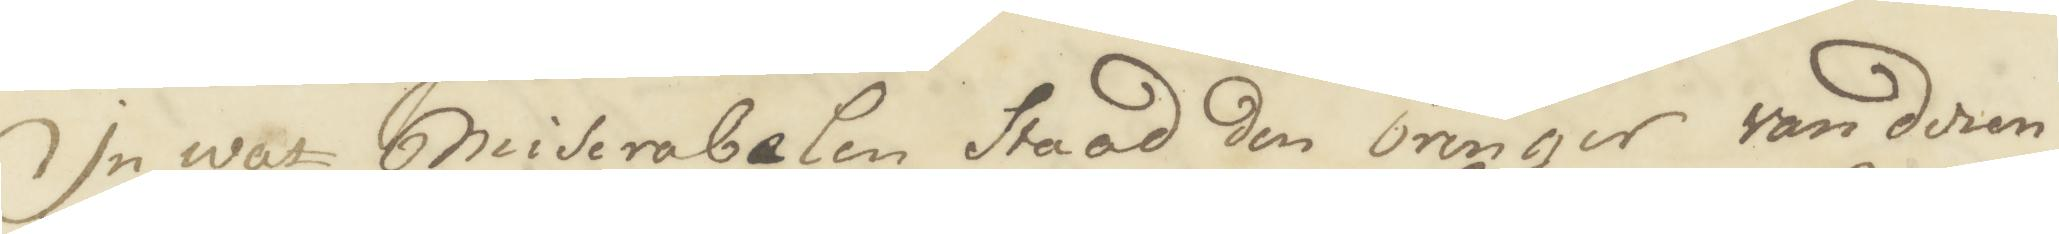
Jn wat miserabelen staad den brenger van dezen
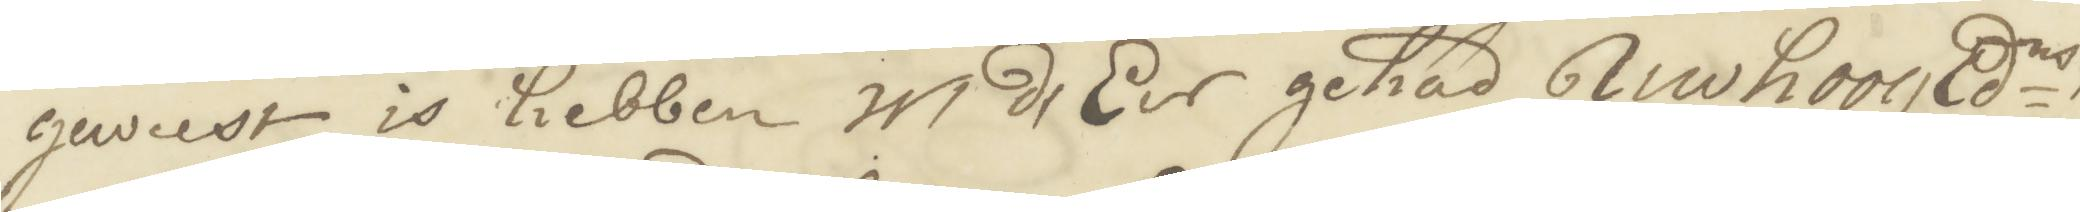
geweest is hebben W' d' Eer gehad uw hoog Ed=ns
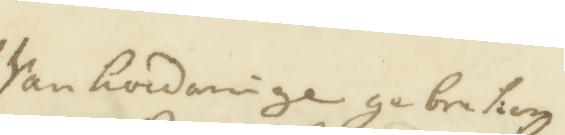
Van hoedanige gebreken
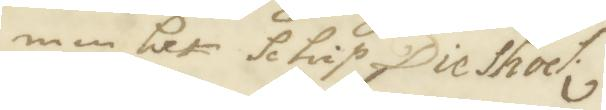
men het schip Dieshoek
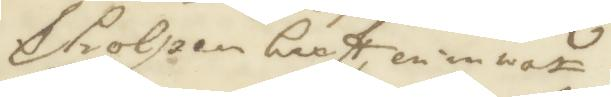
verholpen heeft, en in wat
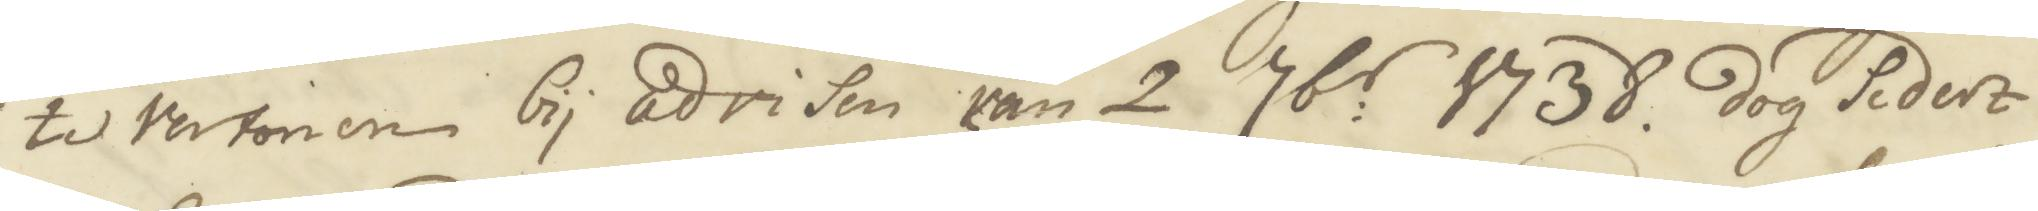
te vertonen bij advisen van 2 7b:r 1738. dog sedert
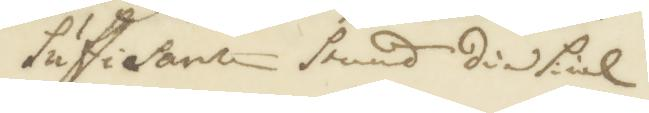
suffisant staad die kiel
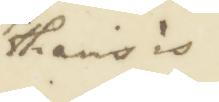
thans is
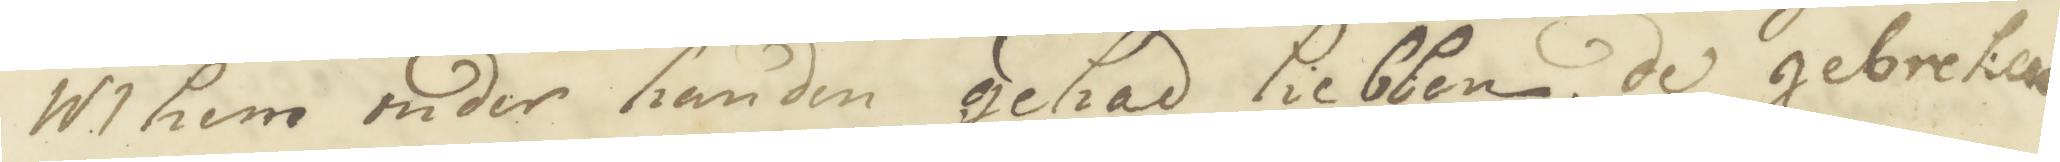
W' hem onder handen gehad hebben, de gebreken
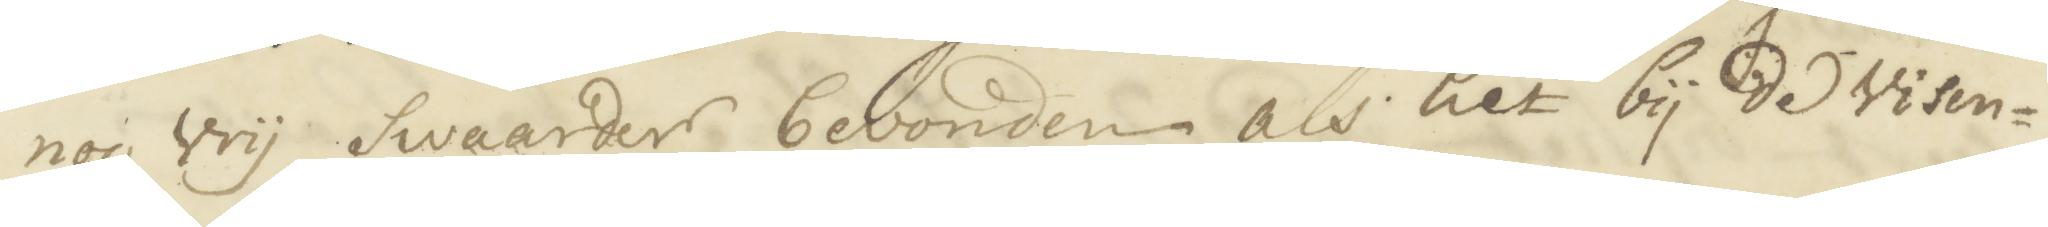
nog vrij swaarder bevonden als het bij de visen=
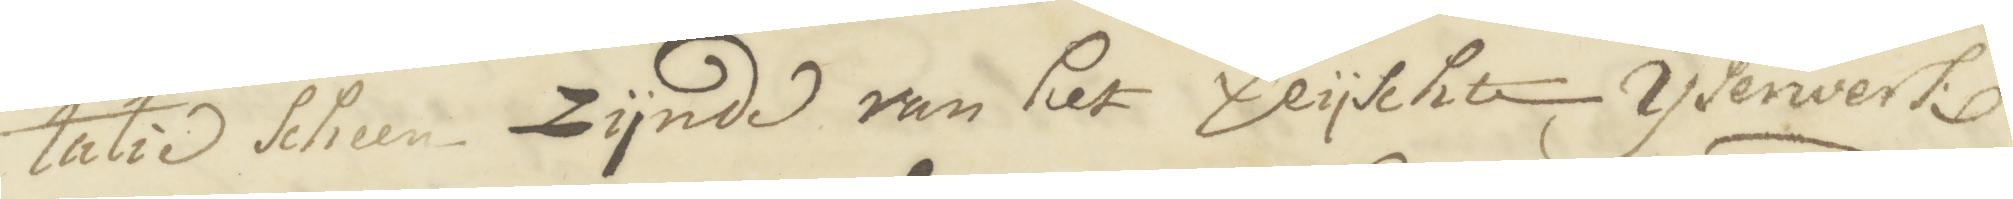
tatie scheen zijnde van het vereijscht ijserwerk
